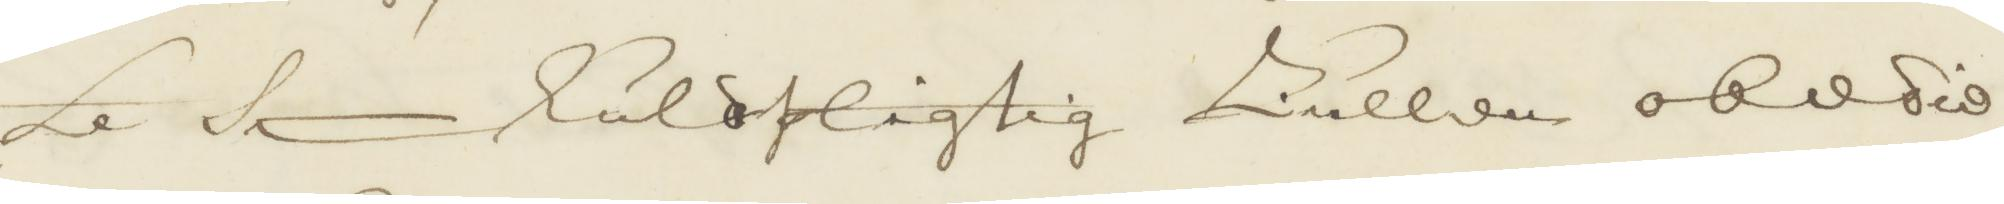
„te schuldpligtig zullen obedie
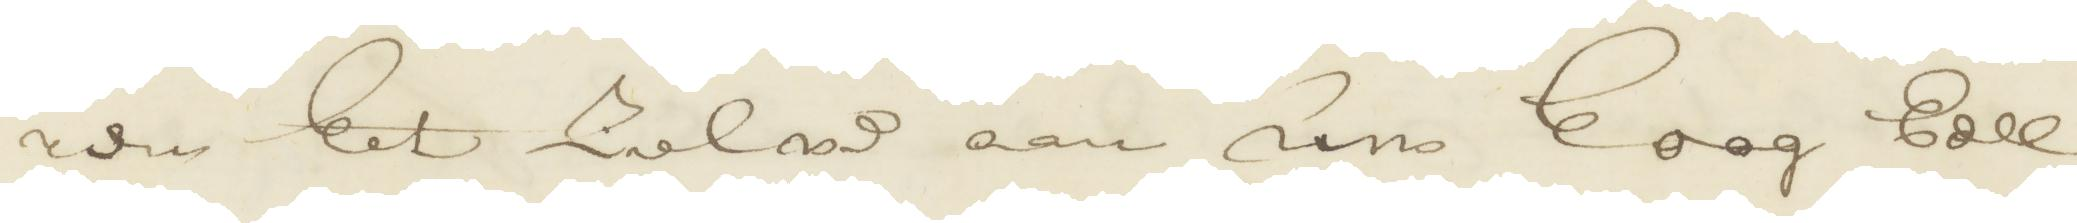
ren het zelve aan uw hoog Edel
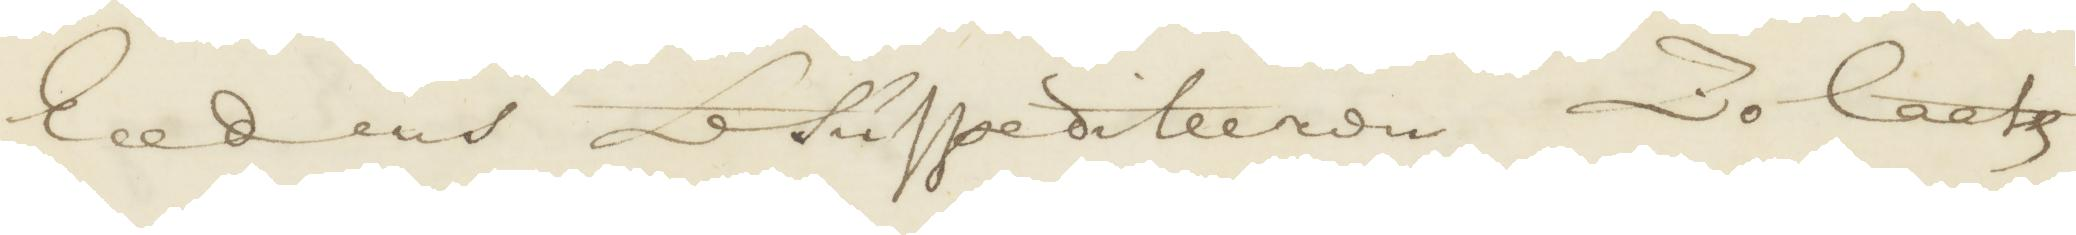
heedens te suppediteeren, zo laaten
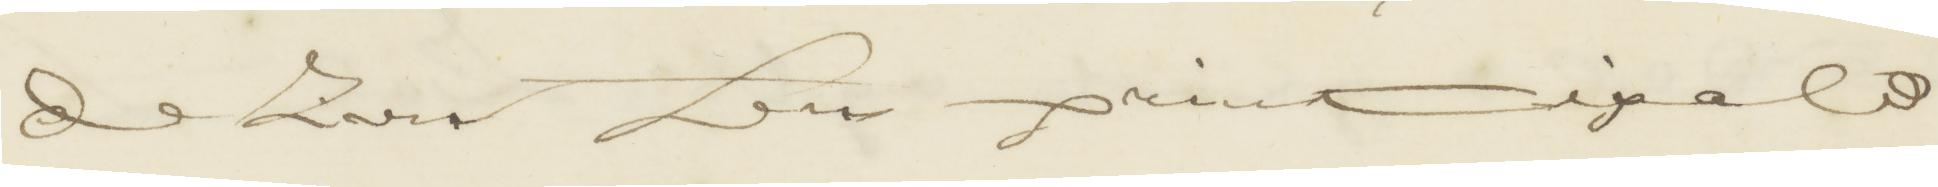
dezen ten principale
